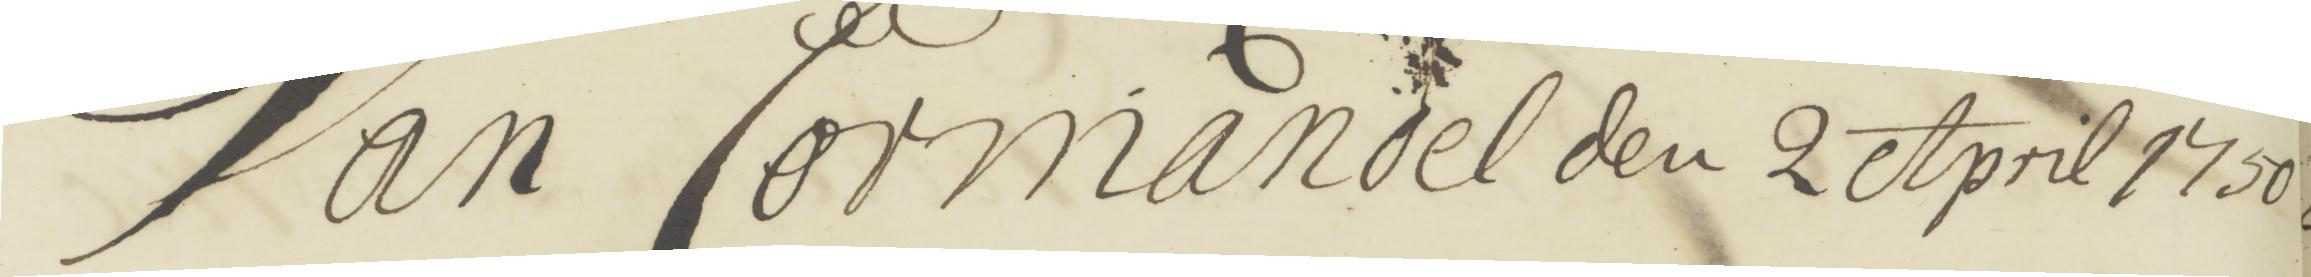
Van Cormandel den 2 April 1750
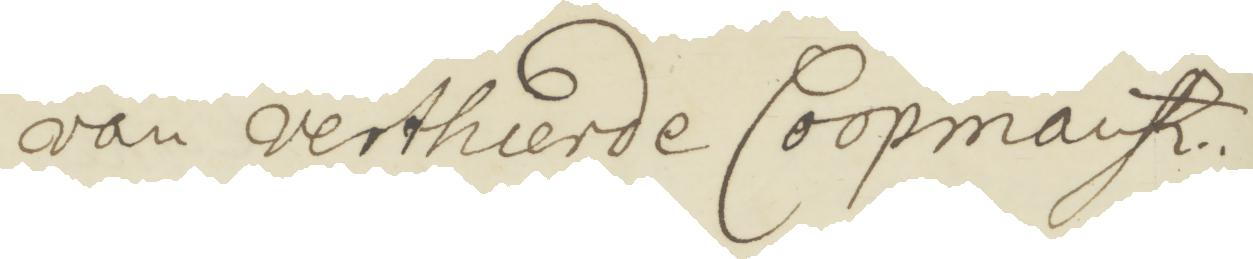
van verthierde Coopmansz:
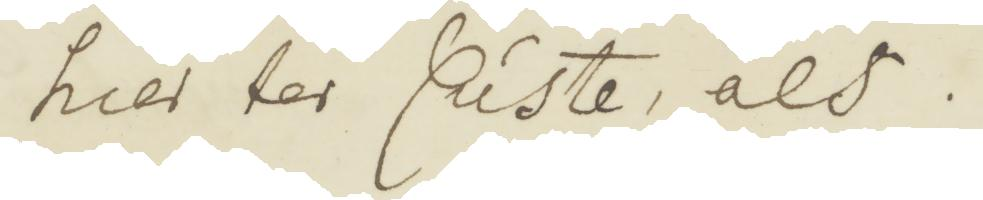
hier ter Custe, als.
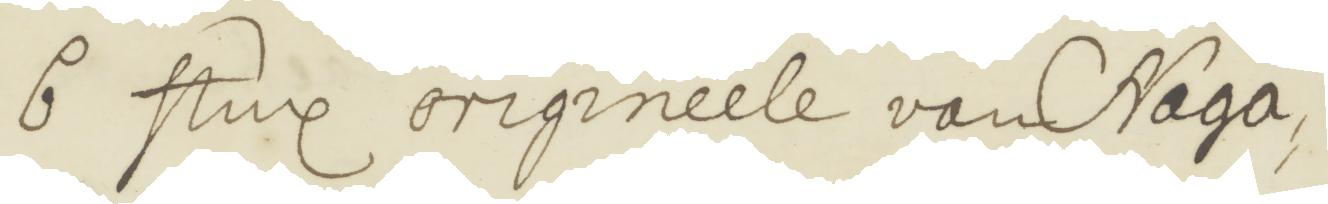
6 stux origineele van Naga„
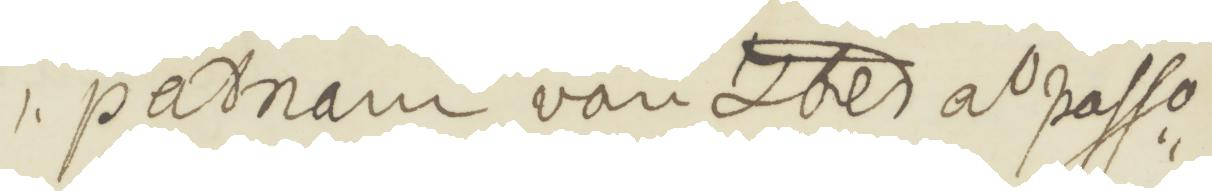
„patnam van zber ao pass„o
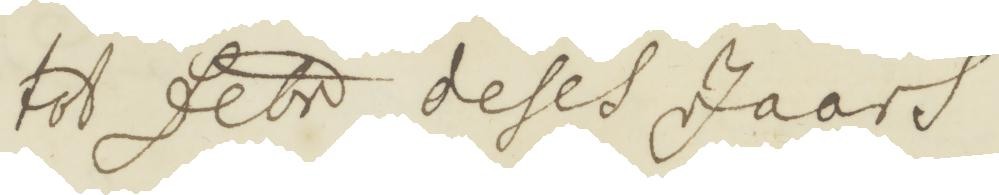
tot febr deses Jaars
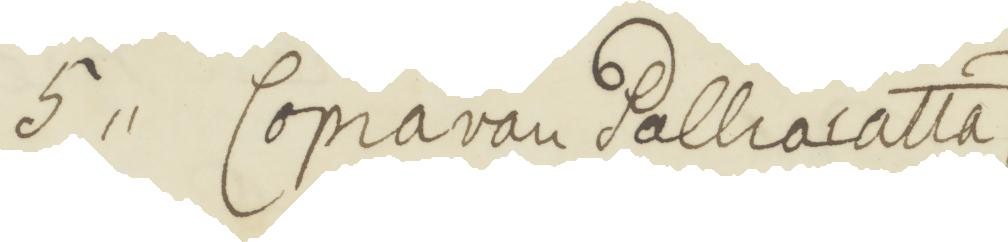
5 „ Copia van Palliacatta
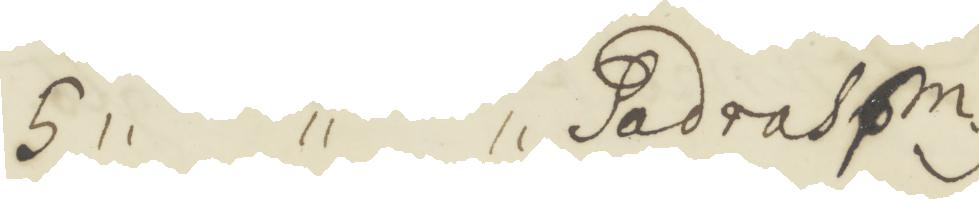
5 „ „ „ Sadraspm
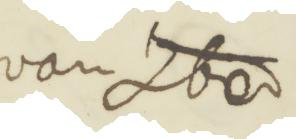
van Jber
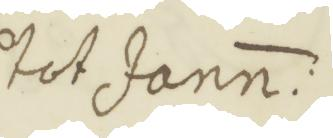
tot Jann:
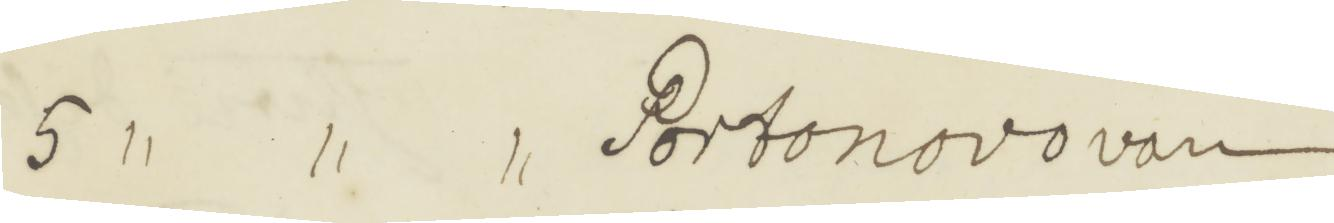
5 „ „ „ Portonovo van
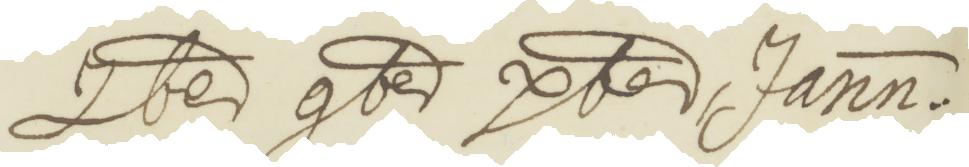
Jber gber xber, Jann:
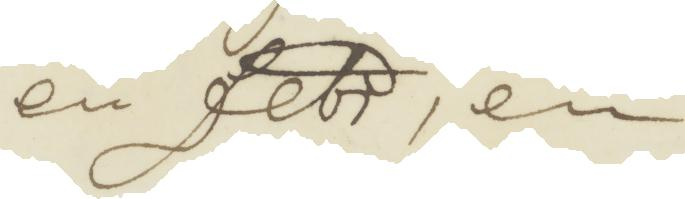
en febr, en
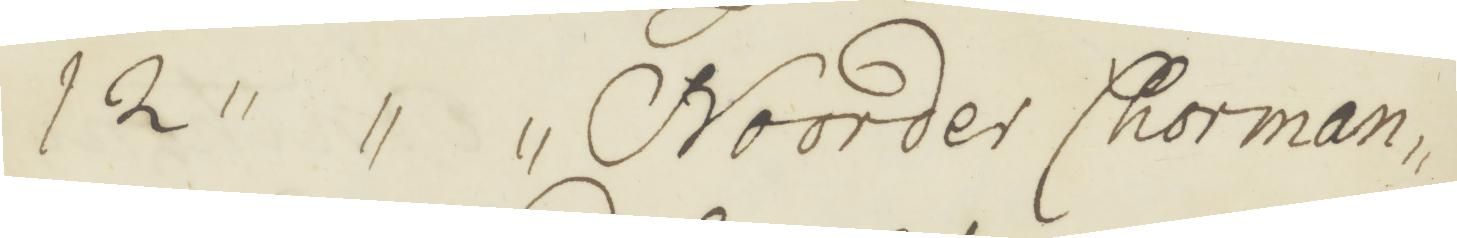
12 „ „ „ Noorder Chorman„
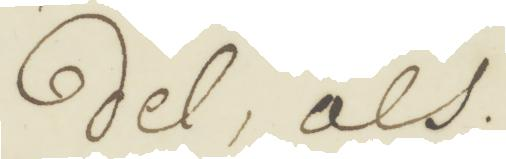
del, als.
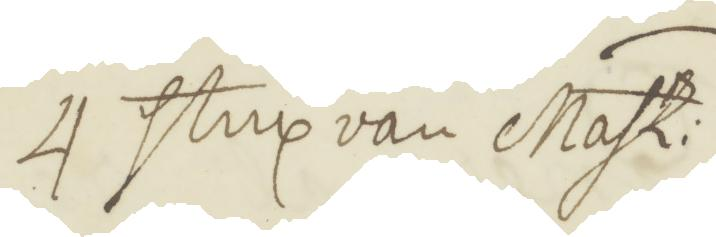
4 stux van Masz:
